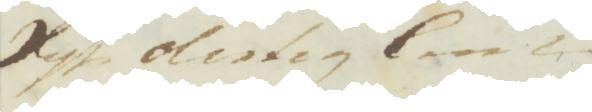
Vijf dertig Cents
